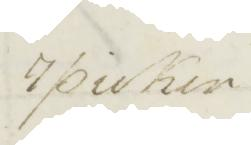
7 pieken
